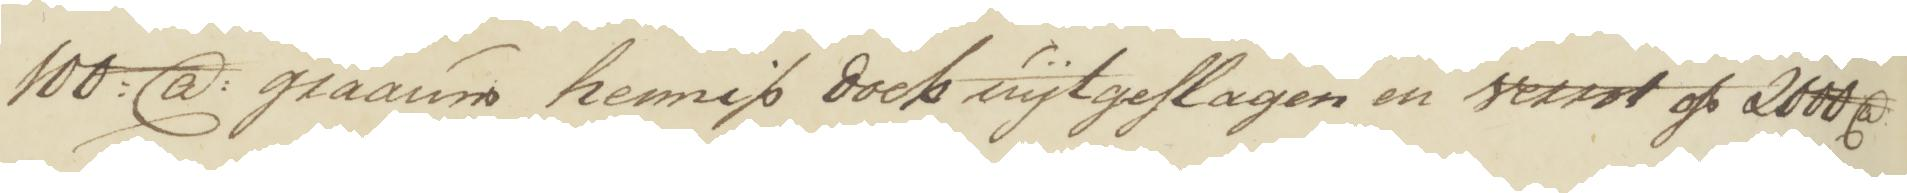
100: Ca: graauw hennip doek uijtgeslagen en verrot of 2600 Ca:
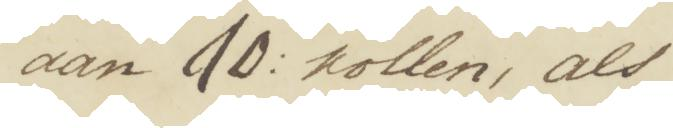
aan 40: kollen, als
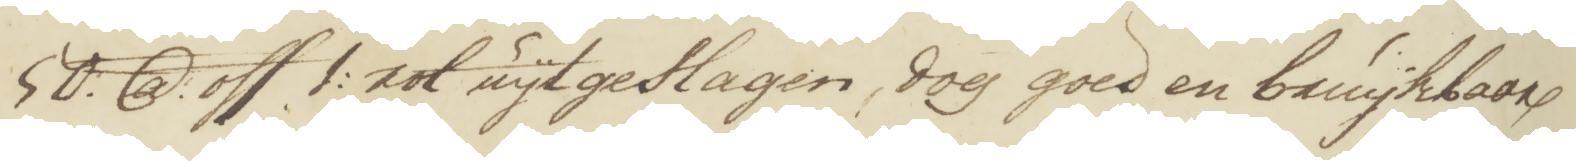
50: Ca: off 1: rol uijtgeslagen, dog goed en bruijkbaar
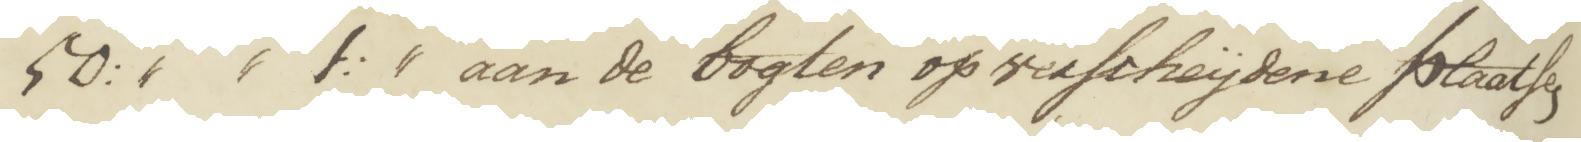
50: „ „ 1: „ aan de bogten op verscheijdene plaatsen
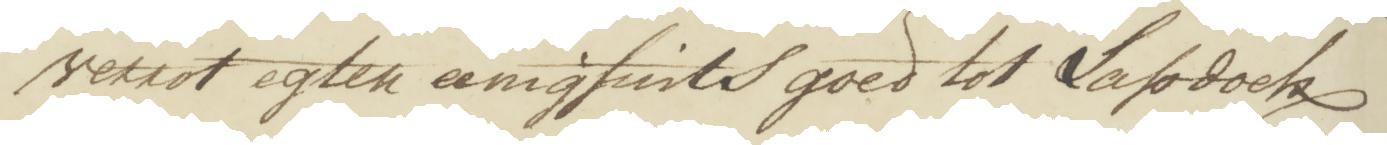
verrot egter eenigsints goed tot Lapdoek
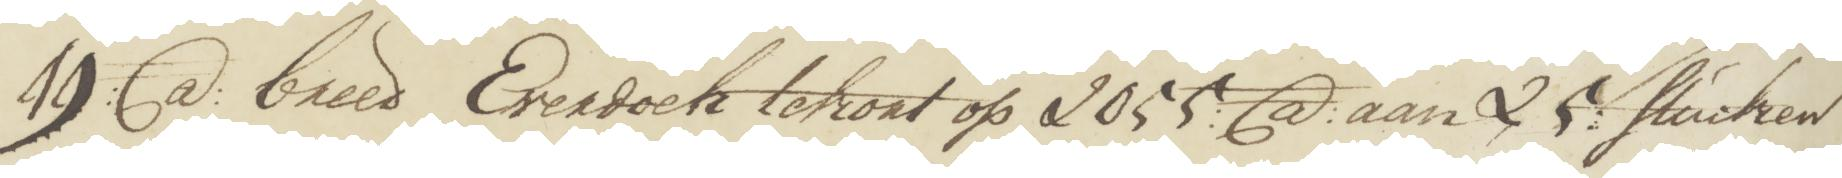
49: Ca: breed Everdoek tekort op 2055: Ca: aan 25: stucken
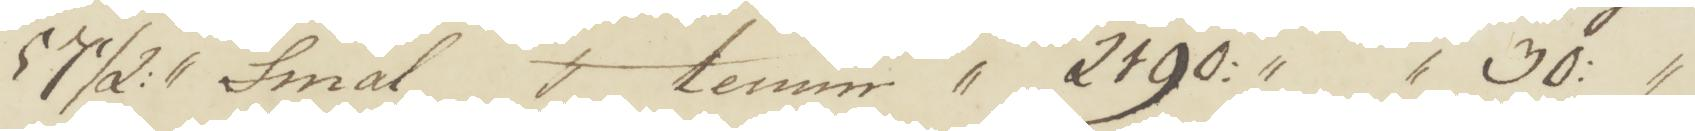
57½:„ smal „ temin „ 2190: „ „ 30:
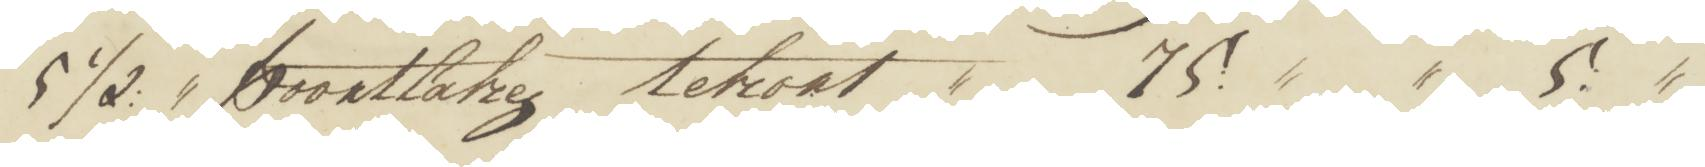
5½: „ poortlaken tekort „ 75: „ „ 5: „
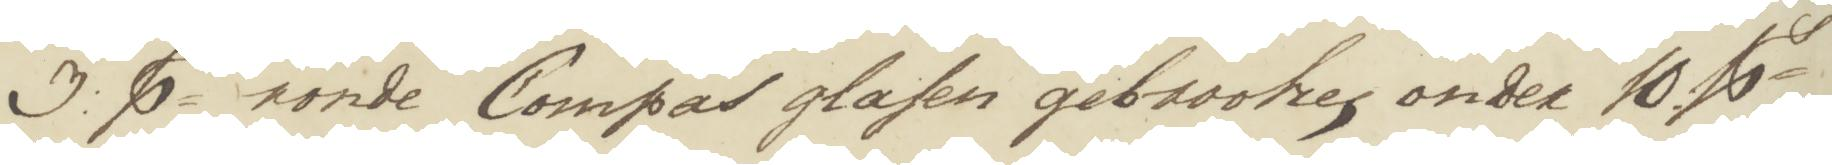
3: p=s ronde Compas glasen gebrooken onder 10: p=s
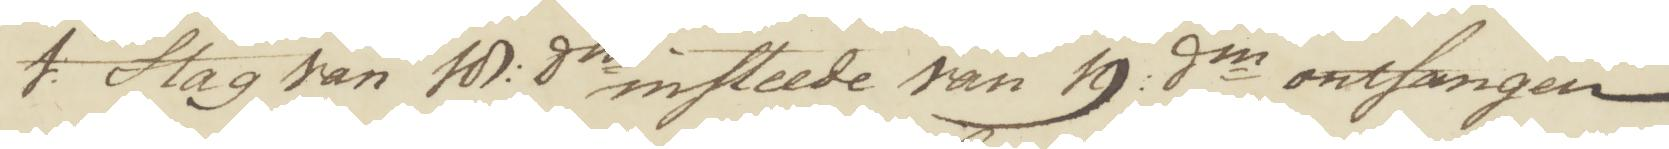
1: Stag van 18: d=m insteede van 19: d=m ontfangen
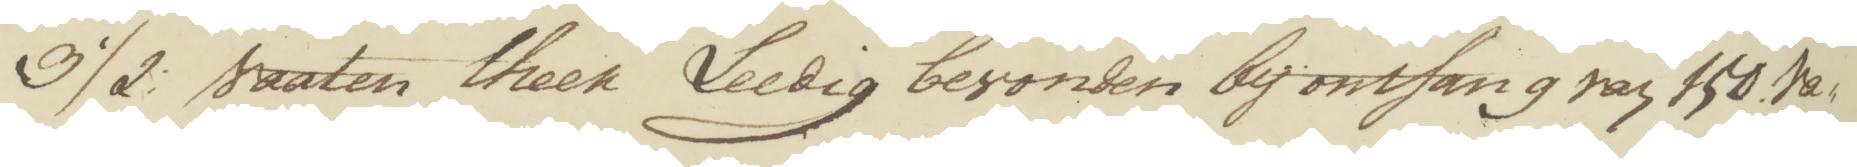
3½: vaaten theer Leedig bevonden bij ontfang van 150. va„
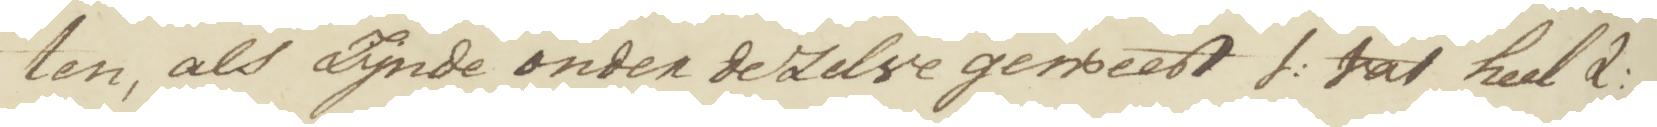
ten, als zijnde onder dezelve geweest 1: vat heel 2:
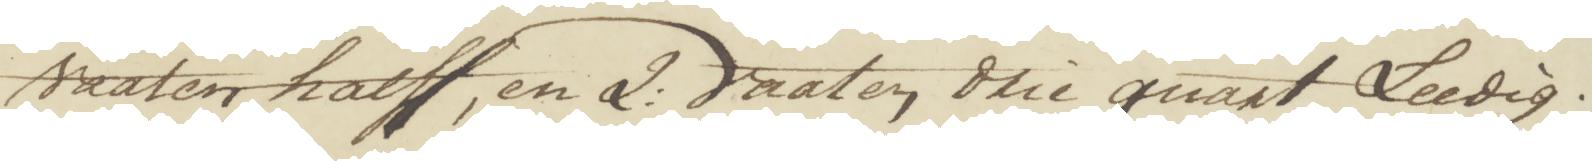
vaaten halff, en 2: vaaten drie quart Leedig.
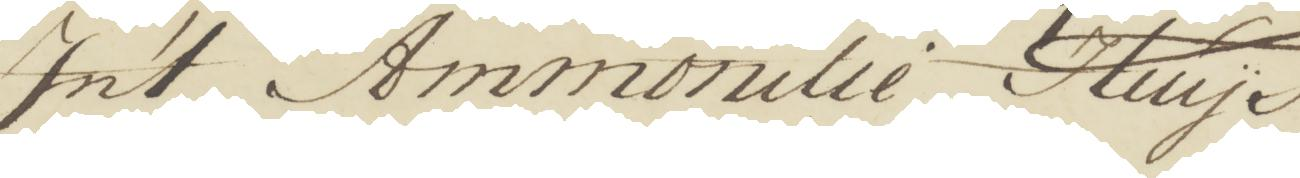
In’t Ammonitie Huijs
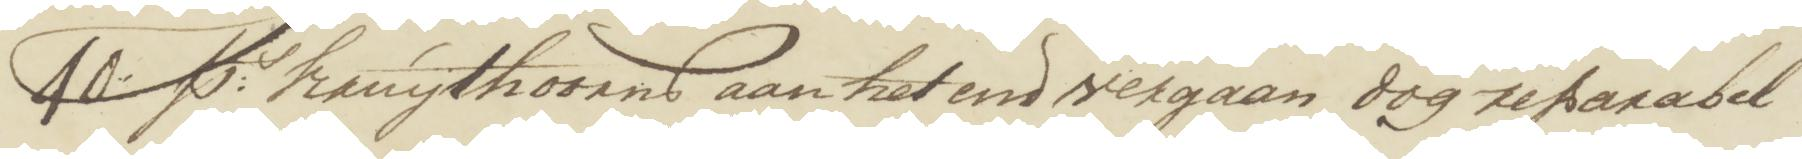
40: p:s kruijthoorns aan het end vergaan dog reparabel
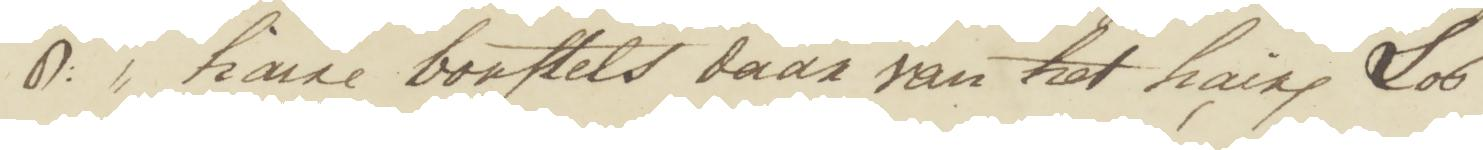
8: „ haire borstels daar van het hair Los
